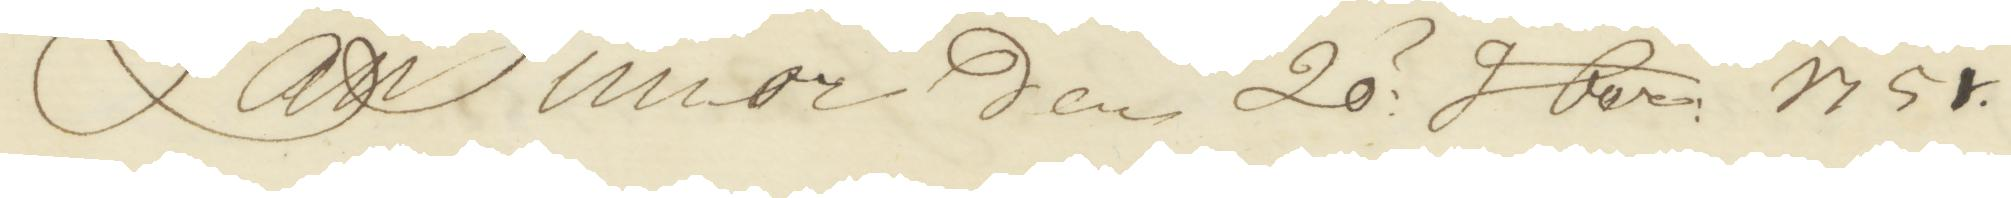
Van Timor den 20:' Jber: 1751.
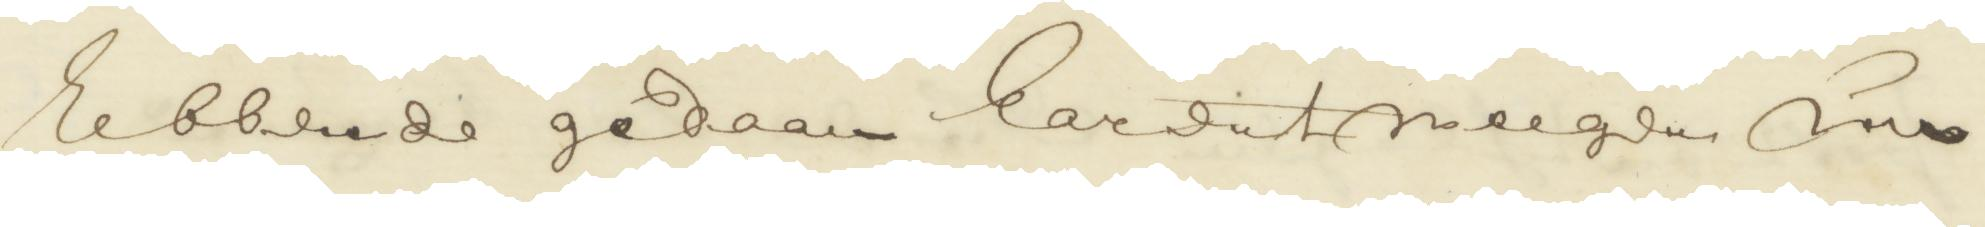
hebbende gedaan harent weegen uw
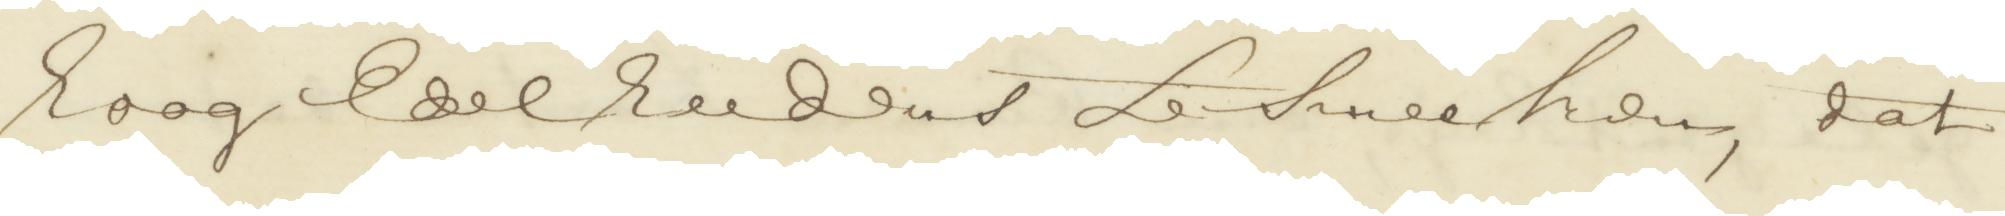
hoog Edelheedens te smeeken, dat
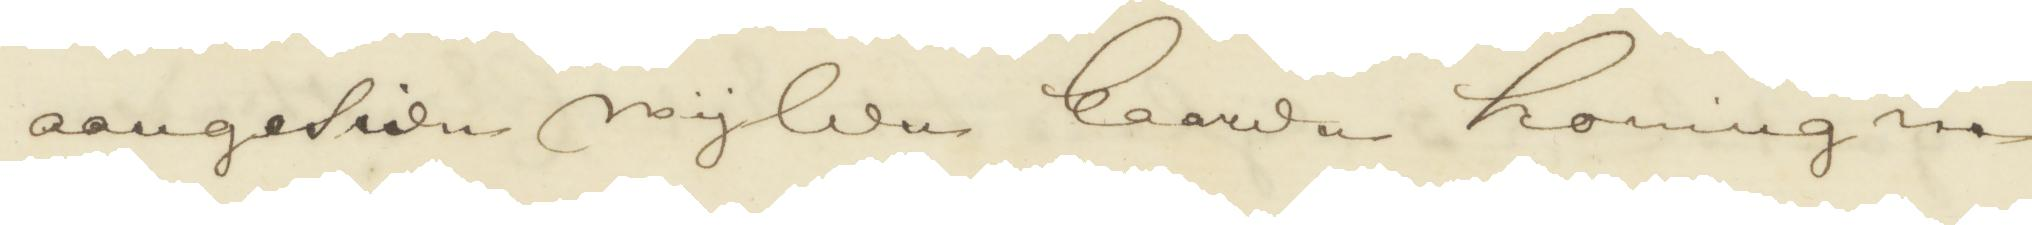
aangesien wijlen haaren koning in
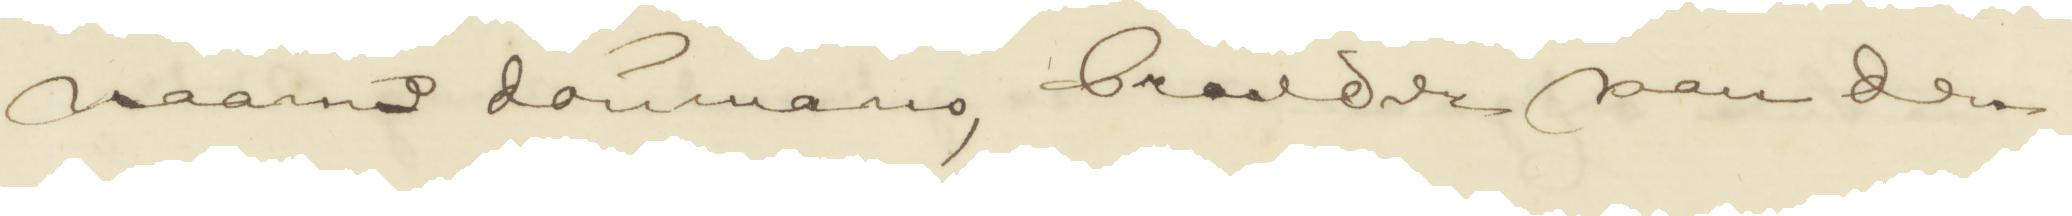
naame doumano, broeder van den
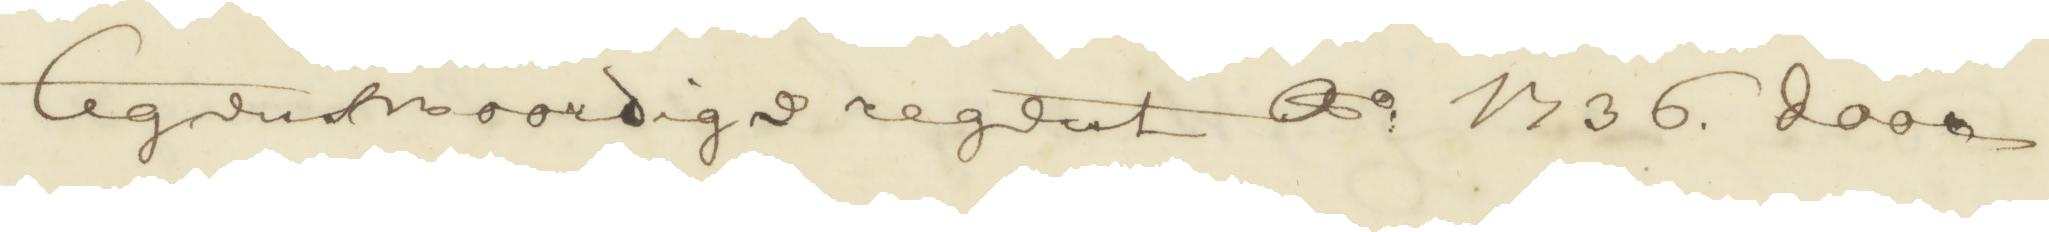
tegenswoordige regent a:o 1736. door
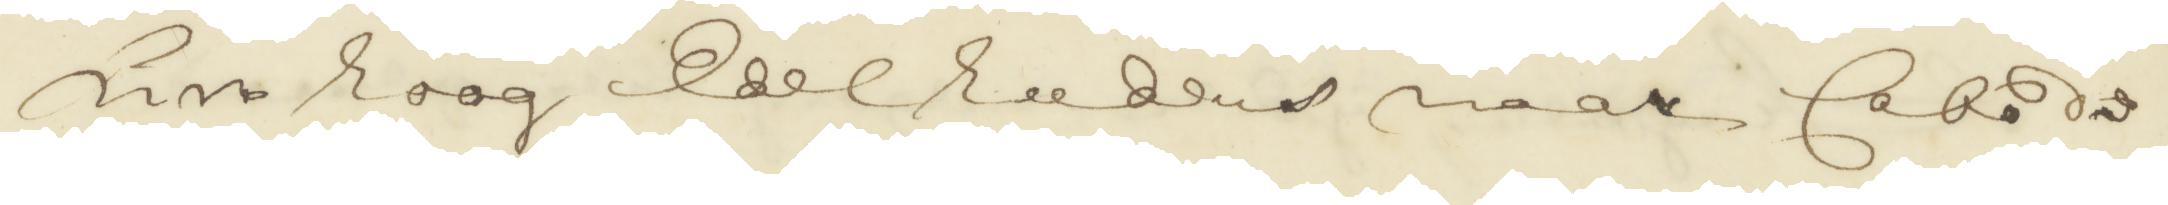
uw hoog Edelheedens naar Cabo de
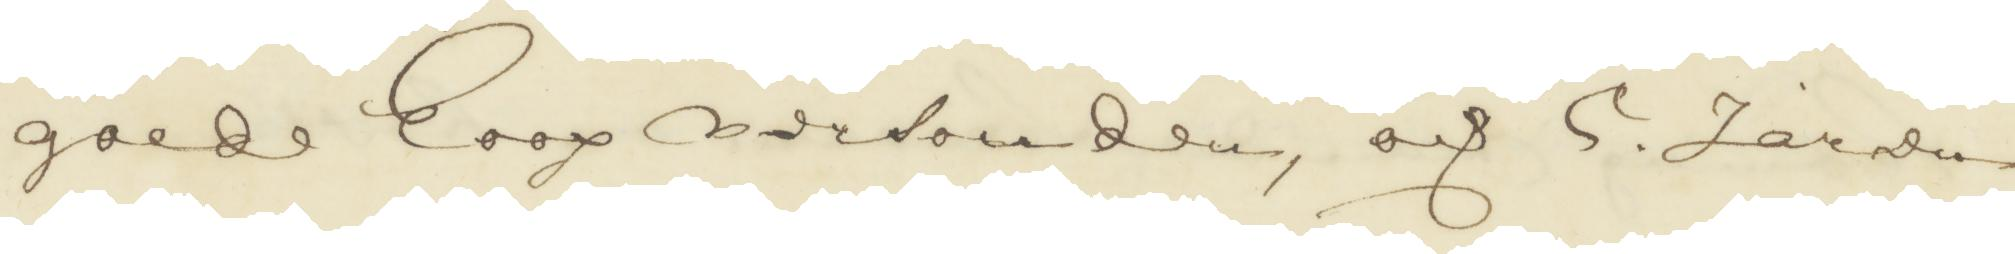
goede hoop versonden, over 5. Jaren
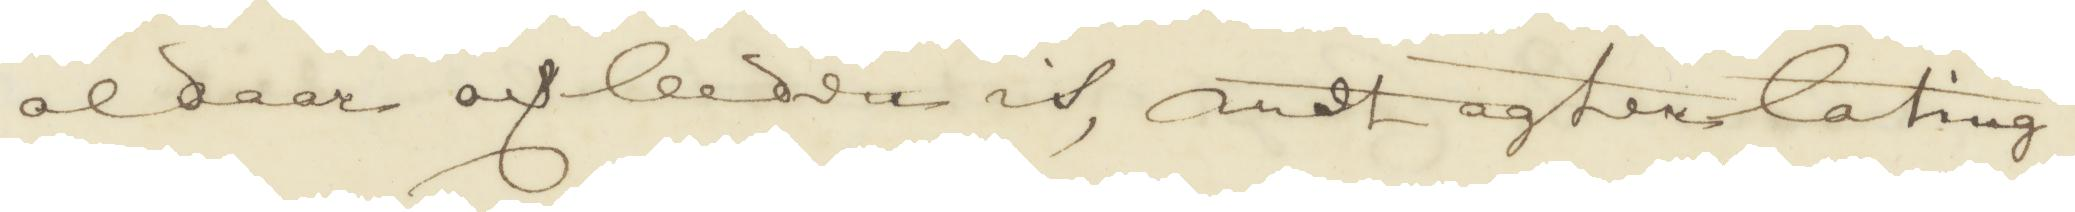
aldaar overleeden is, met agter lating
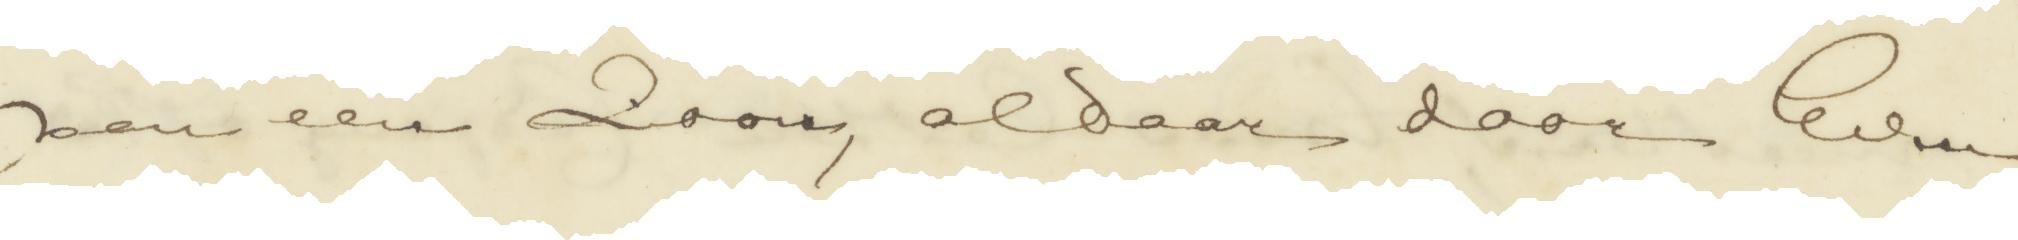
van een zoon, aldaar door hem
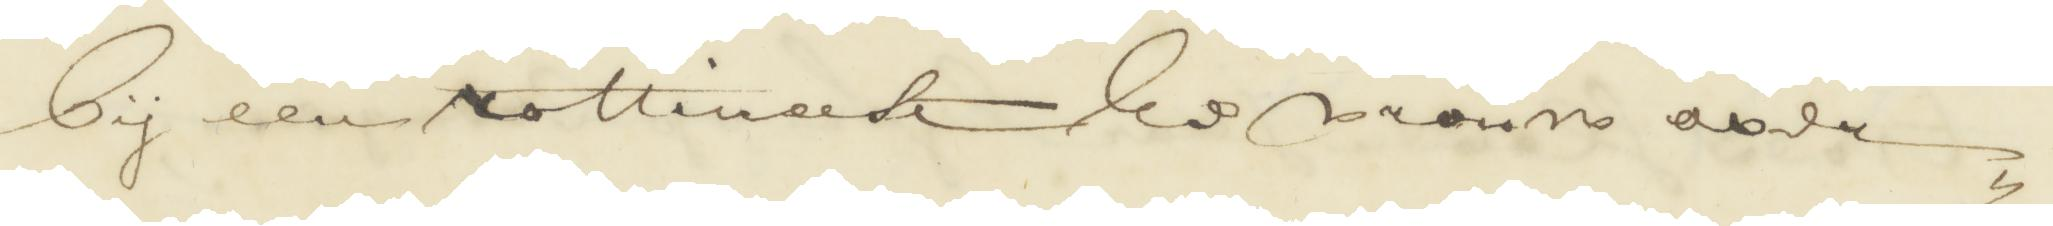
bij een rottineesche vrouw over„
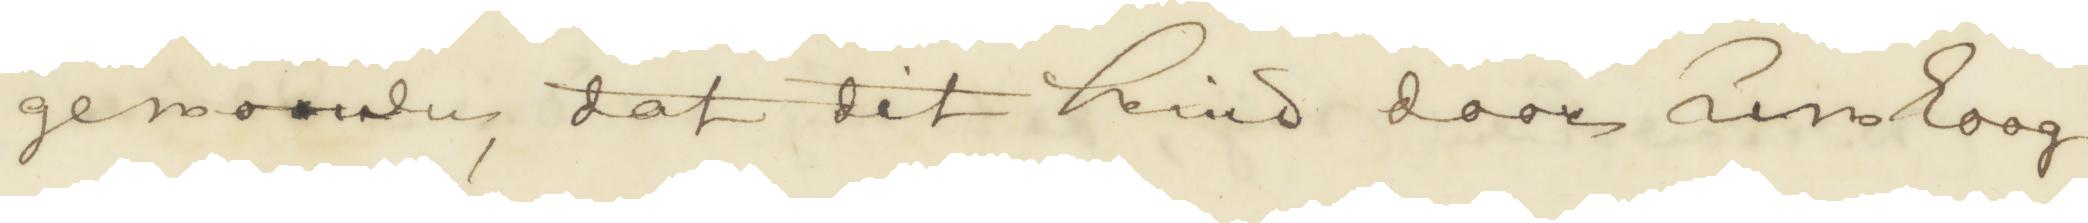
gewoonen, dat dit kind door uw hoog
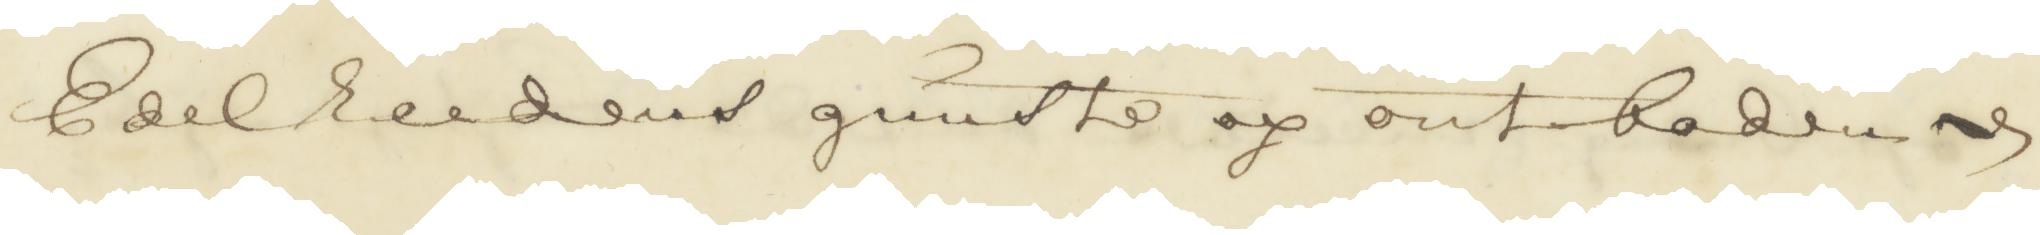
Edelheedens gunste op ontboden en
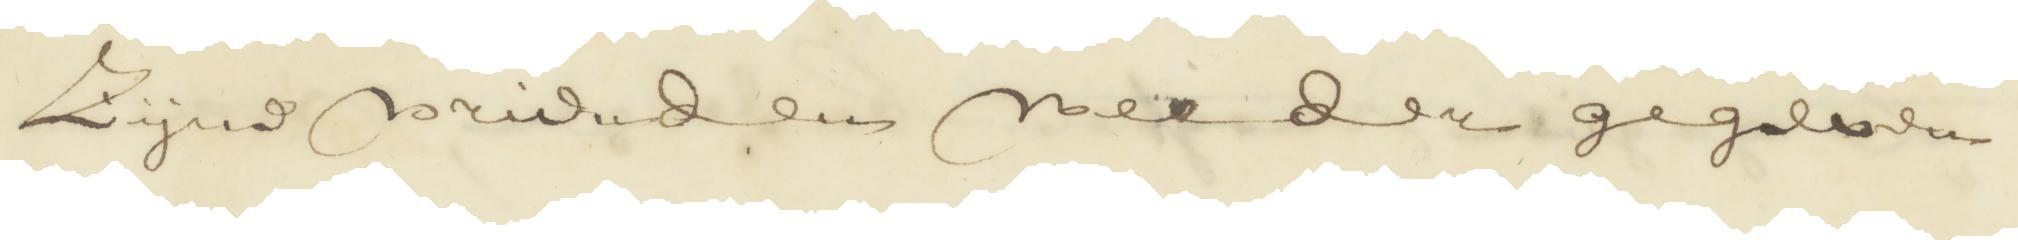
zijne vrienden weeder gegeven
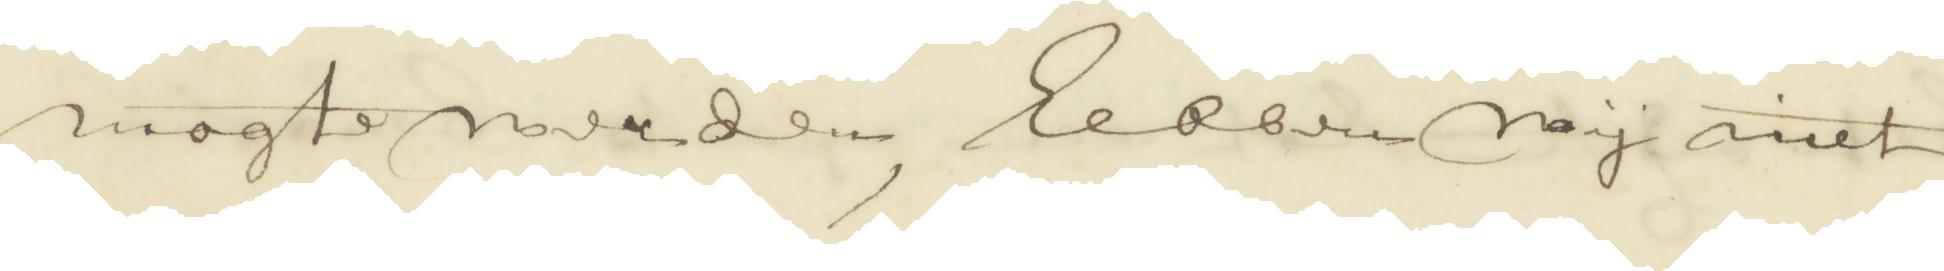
mogte werden, hebben wij niet
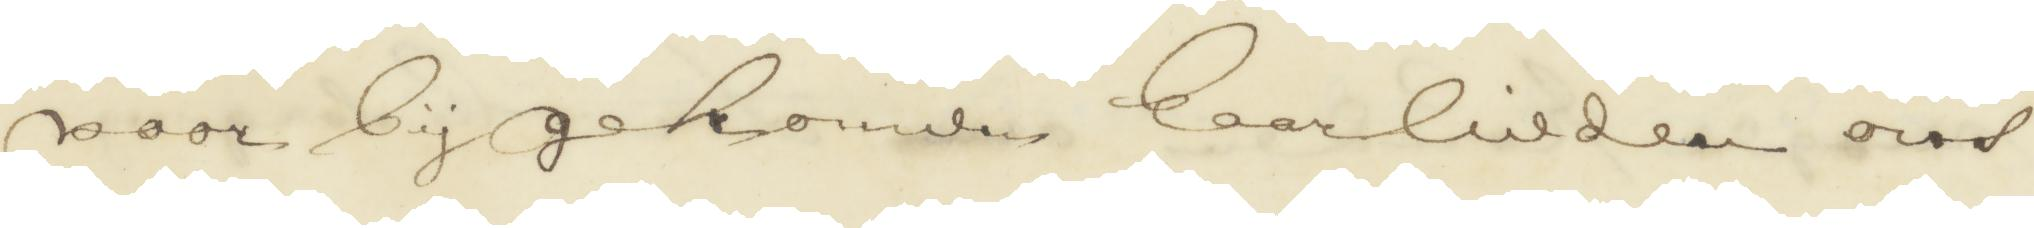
voor bij gekomen haarlieden ons
